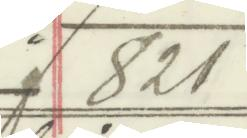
ƒ 821
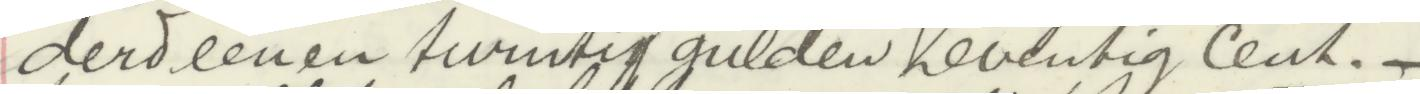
derd een en twintig gulden zeventig Cent.
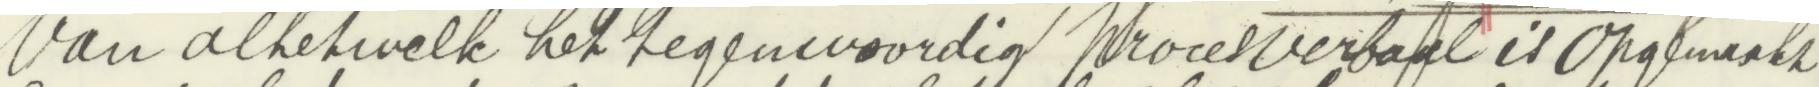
Van alhetwelk het tegenwoordig procesverbaal is opgemaakt
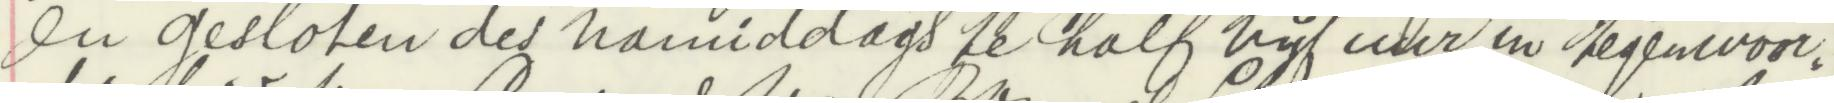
en gesloten des namiddags te half vijf uur in tegenwoor„
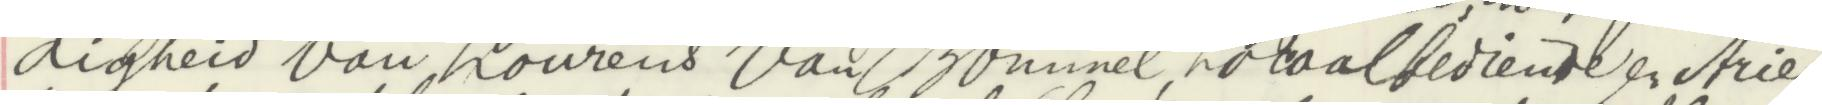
digheid van Lourens van Bommel, Locaal bediende, en Arie
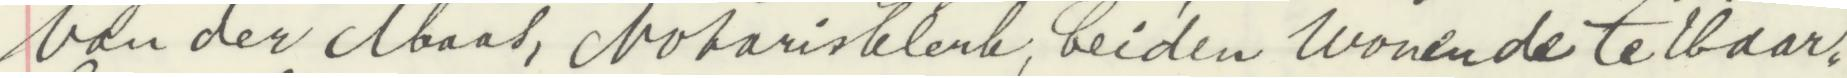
van der Maas, Notarisklerk, beiden wonende te Haar„
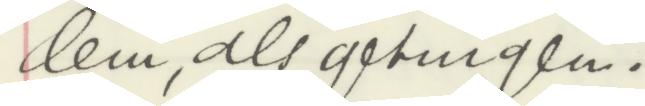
lem, als getuigen
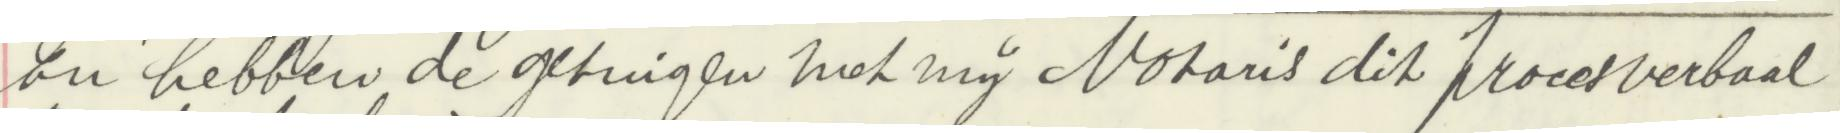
En hebben de getuigen met mij Notaris dit procesverbaal
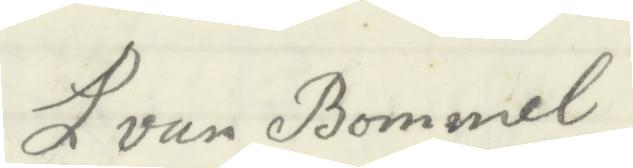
L van Bommel
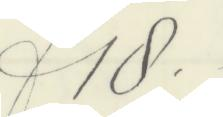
ƒ18.
